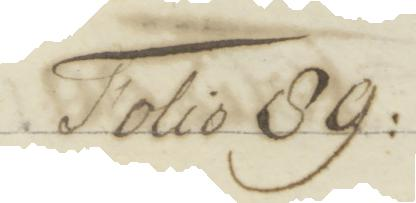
Folio 89:
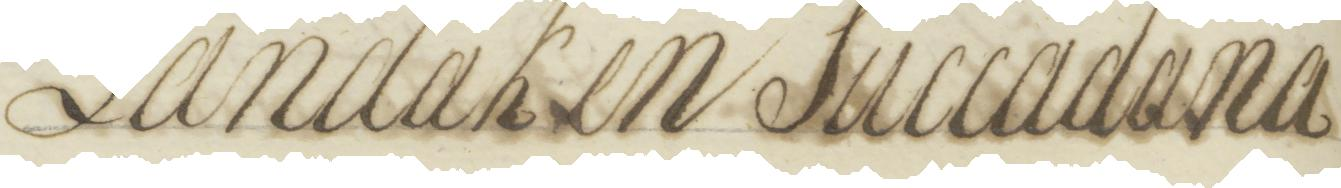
Landak en Succadana
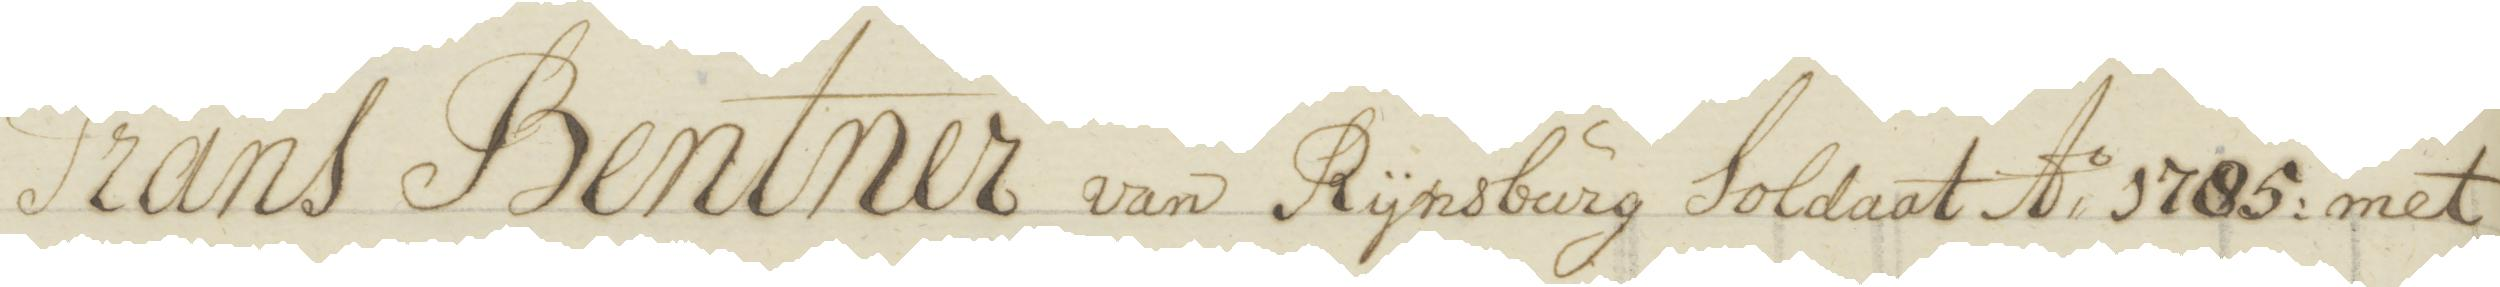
Frans Bentner van Rijnsburg Soldaat A„o 1785: met
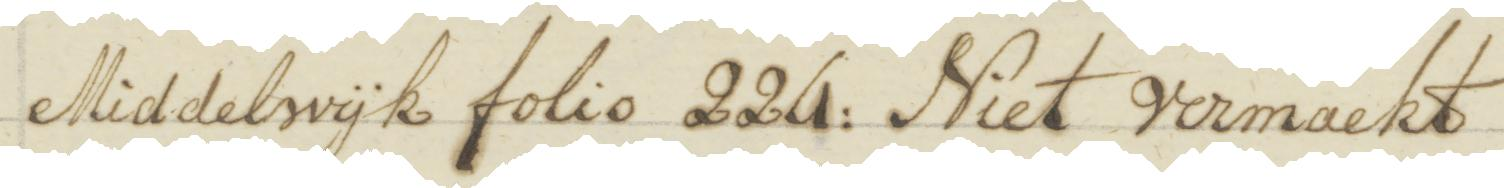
Middelwijk folio 224: Niet vermaekt
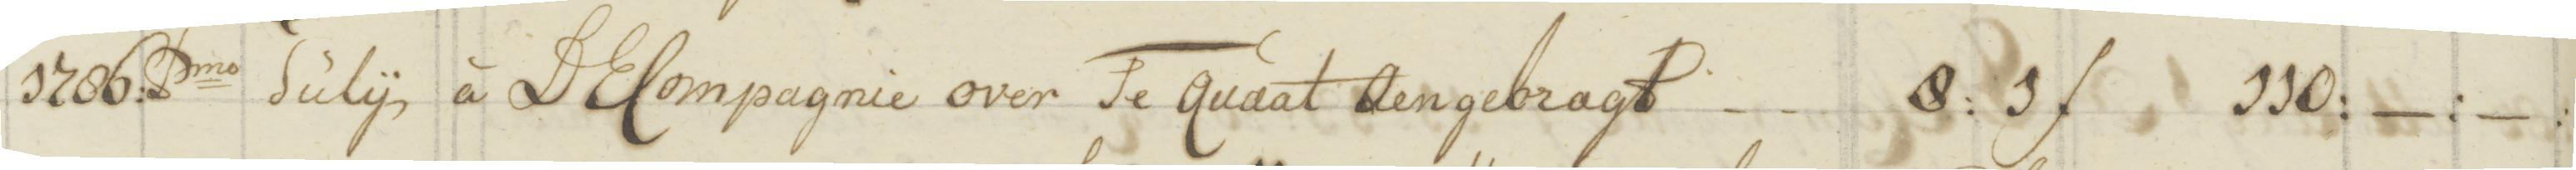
1786: P=mo Iulij â DECompagnie over Te quaat Aengebragt - - - 8: 1 ƒ 110:—:—:
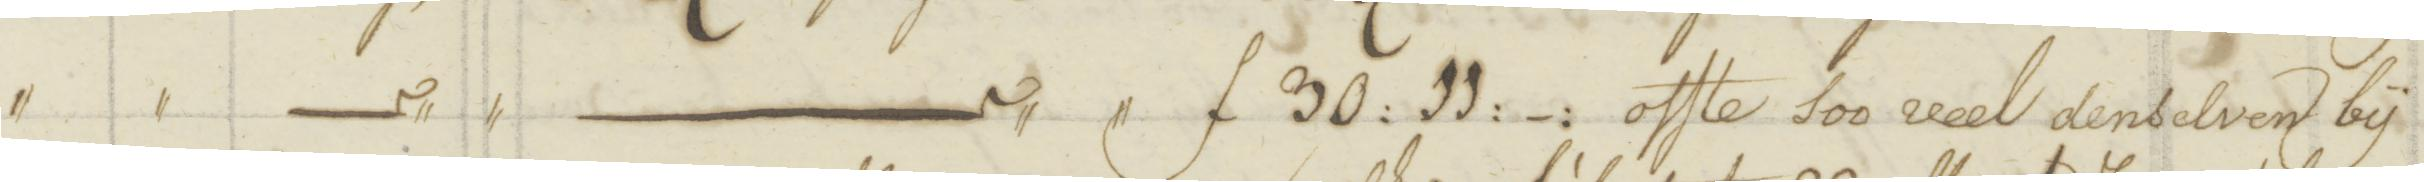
„ „ _„o „ _„o „ ƒ 30: 11:-: offte soo veel denselven bij
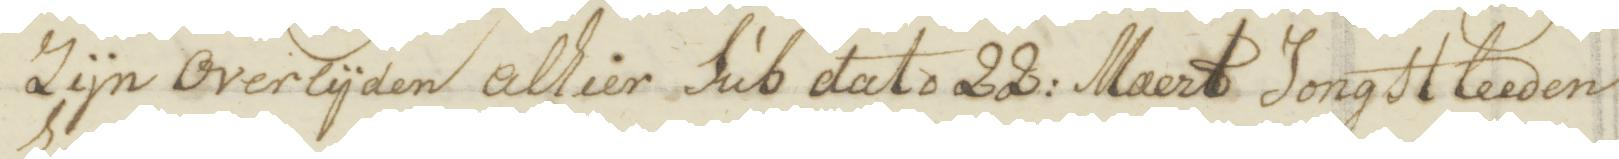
zijn overlijden alhier sub dato 22: Maert Jongstleeden
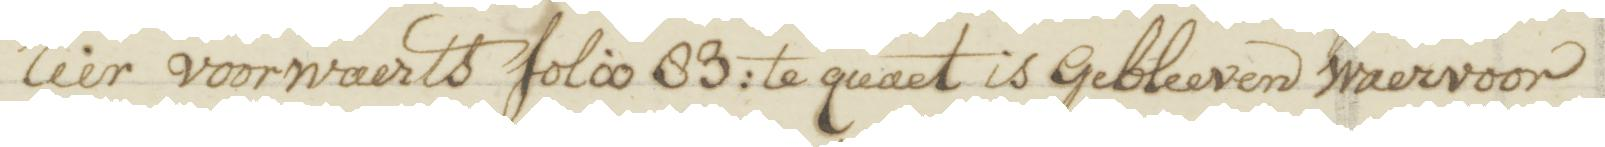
heer voorwaerts folio 83: te quaet is Gebleeven waervoor
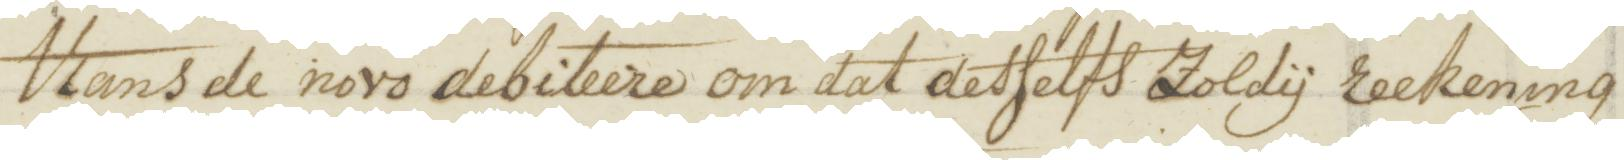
thans de novo debiteere om dat desselfs zoldij reekening
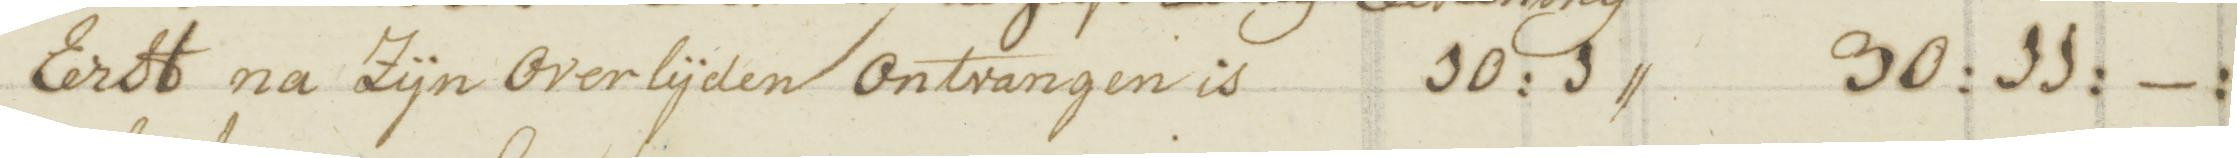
Eerst na zijn overlijden ontvangen is 10: 1„ 30: 11: — :
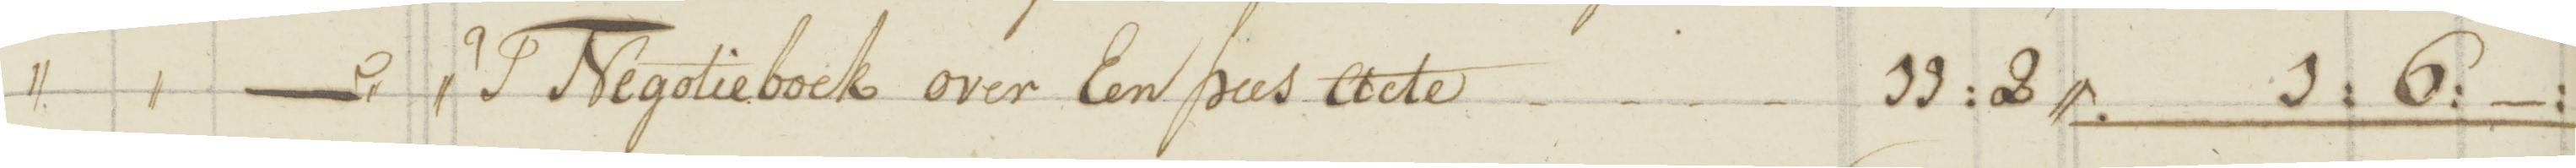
„ _„o „'T Negotieboek over Een pas Acte - - - - 11 : 2 „. 1: 6: —:
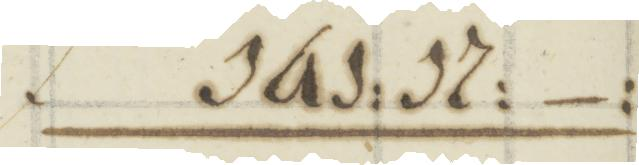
ƒ 141: 17: — :
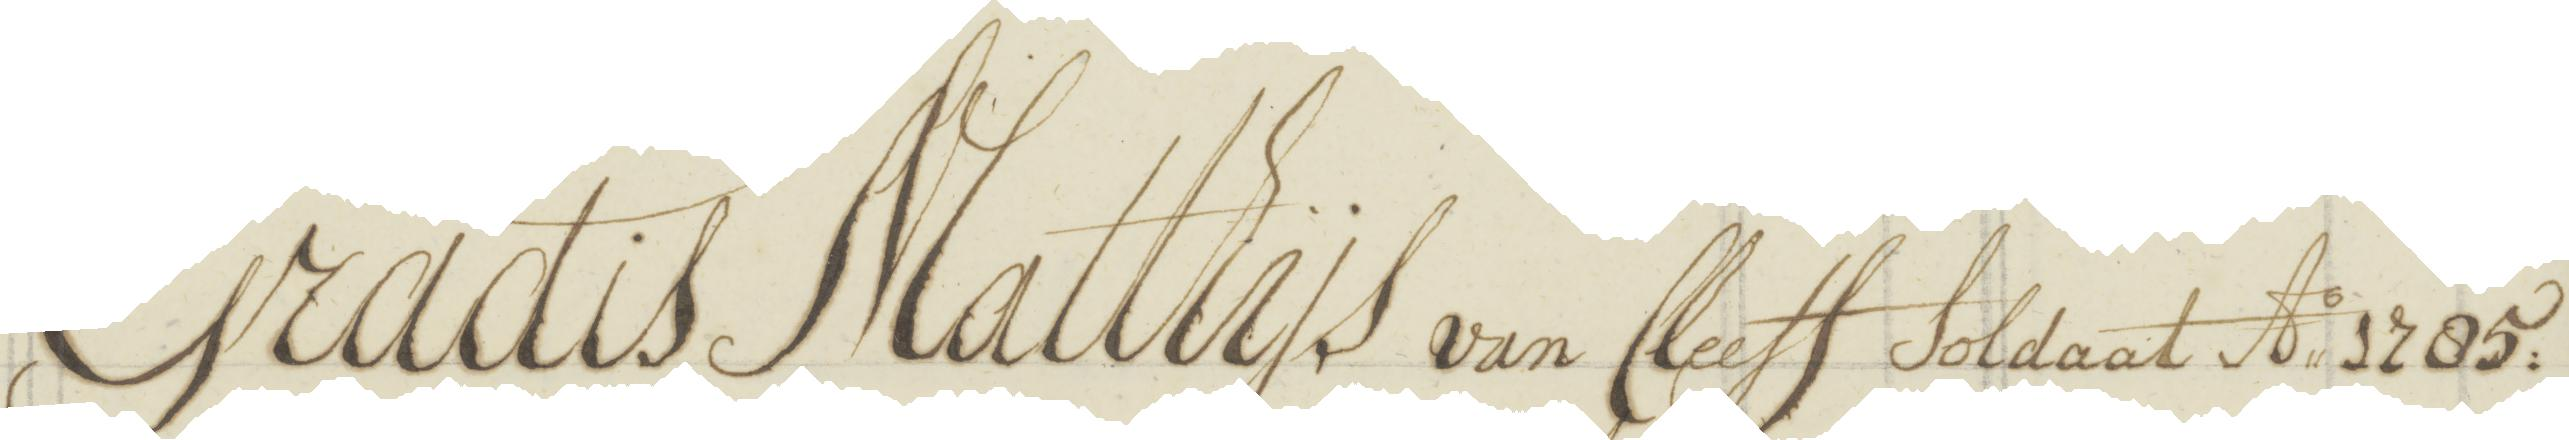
Gradis Malthijs van Cleeff Soldaat A„o 1785:
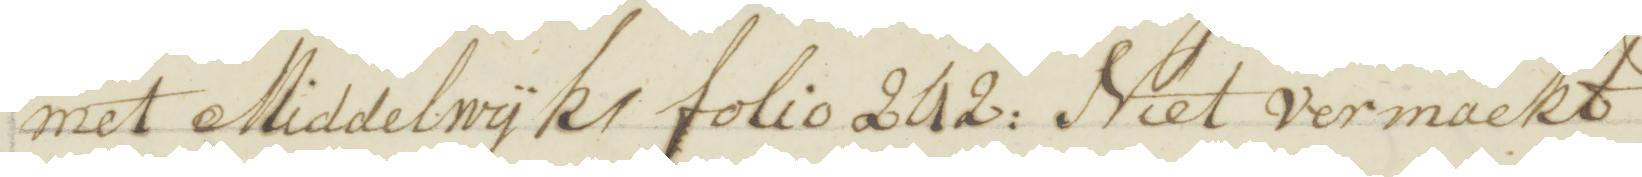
met Middelwijk folio 242: Niet vermaekt
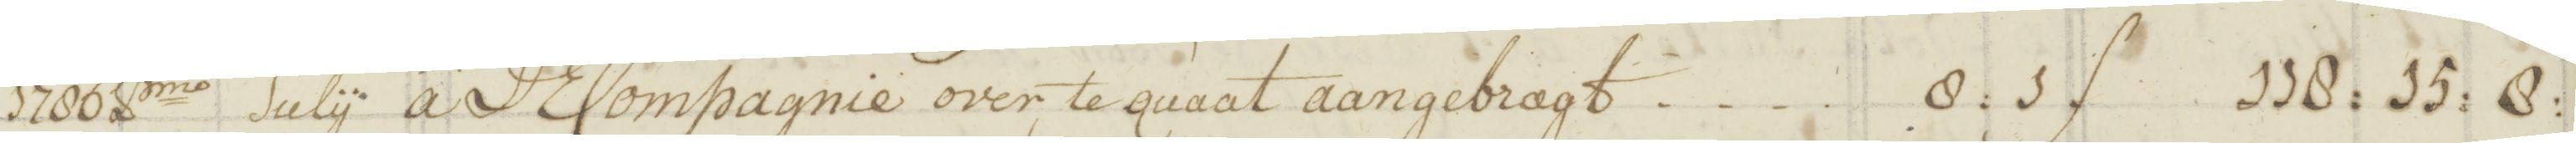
1786 P=mo Iulij â DECompagnie over te quaat aangebragt - - - - 8: 1 ƒ 118: 15: 8:
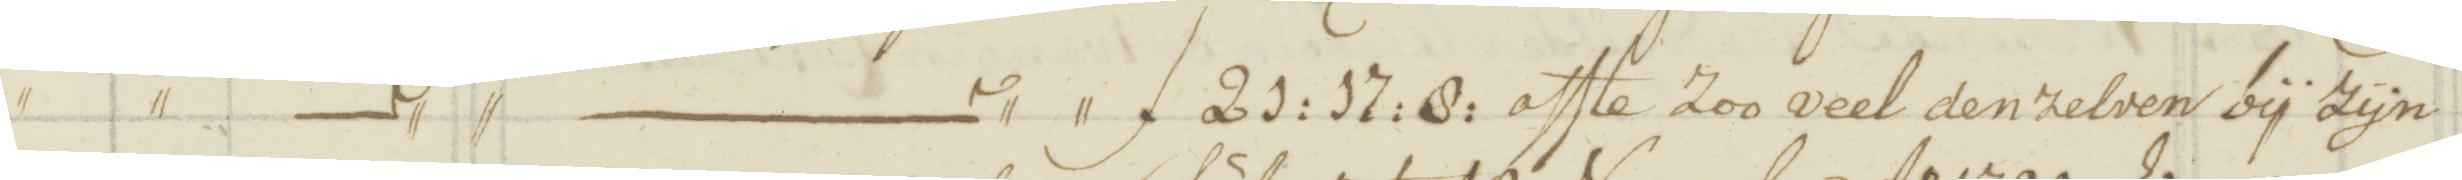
„ „ _„o „ _„o „ ƒ 21: 17: 8: affte zoo veel den zelven bij zijn
